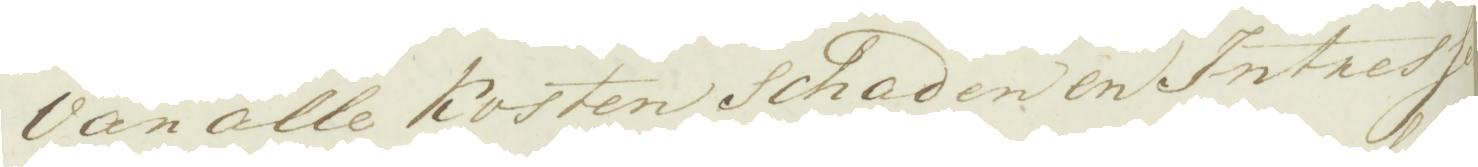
van alle Kosten schaden en Intresse
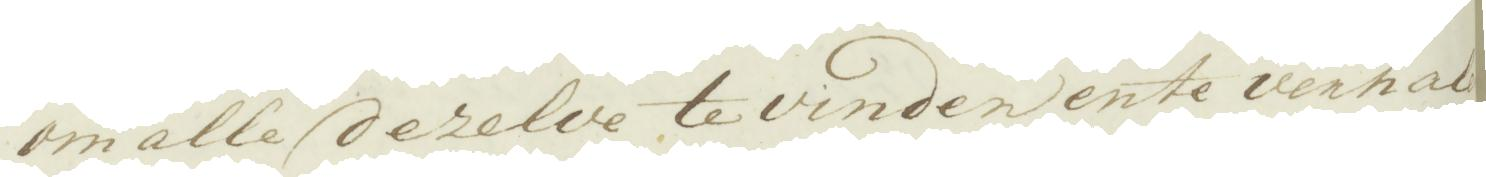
om alle dezelve te vinden en te verhale
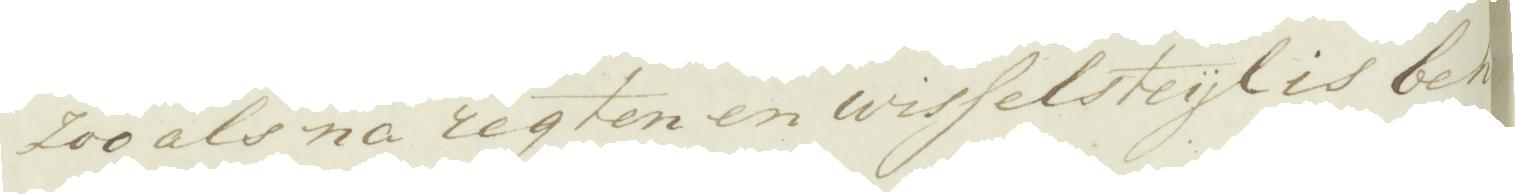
zoo als na regten en wisselsteijl is beh
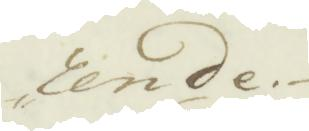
„rende.-
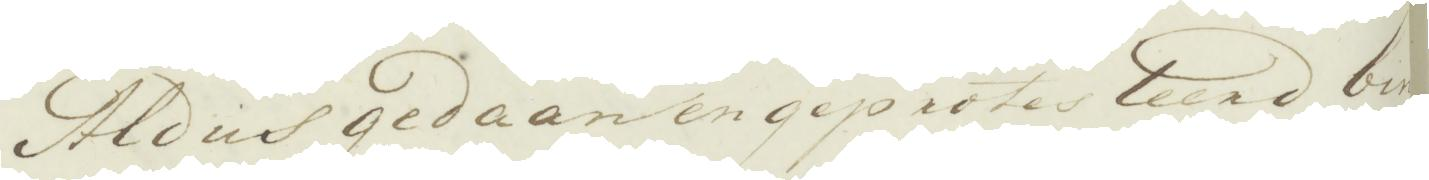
Aldus gedaan en geprotesteerd bin
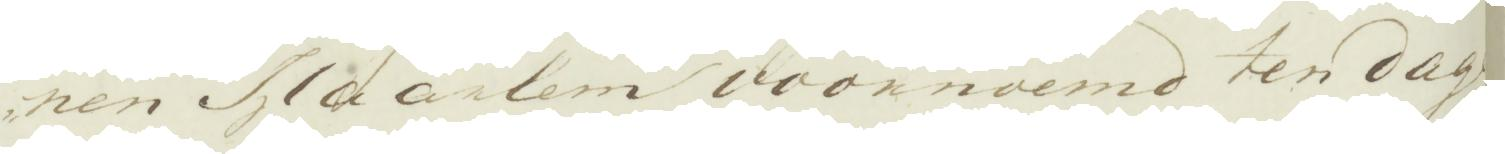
„nen Haarlem voornoemd ten dag
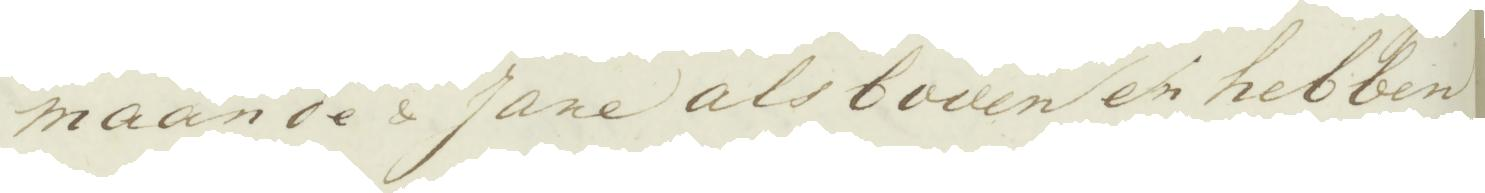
maande & Jare als boven en hebben
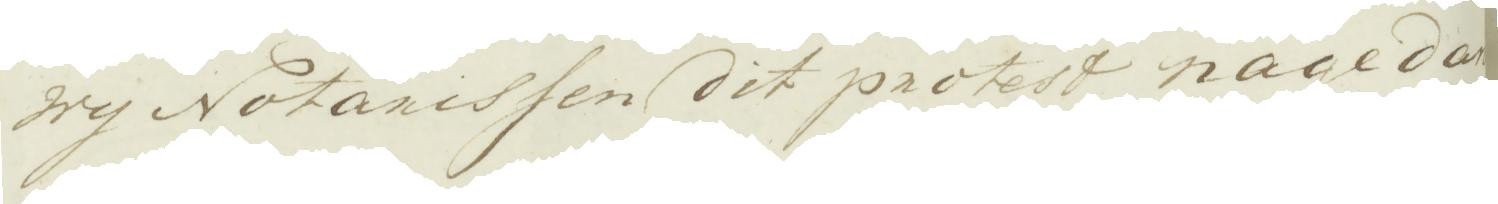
wy Notarissen dit protest nagedan
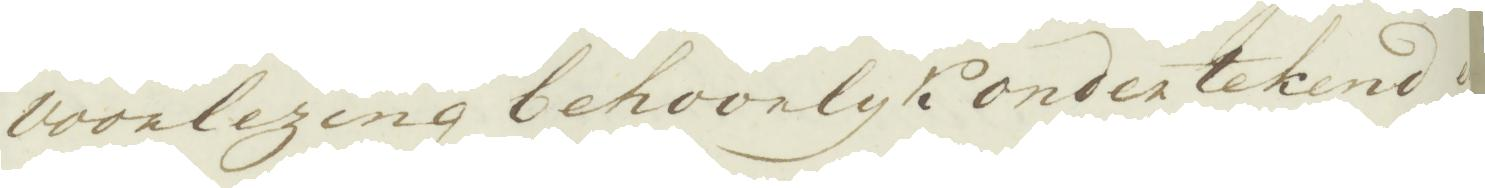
voorlezing behoorlyk ondertekend e
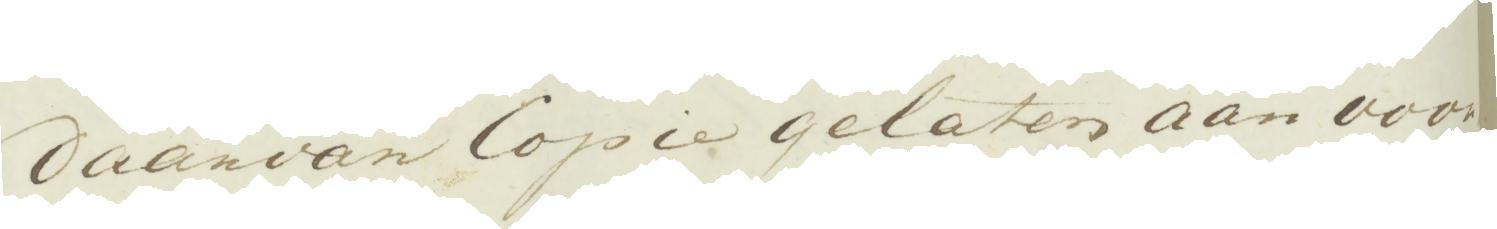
daarvan Copie gelaten aan voor
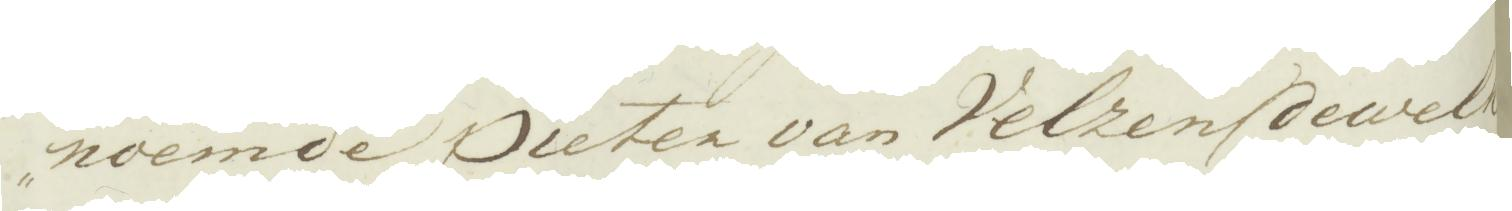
„noemde Pieter van Velzen, dewelk
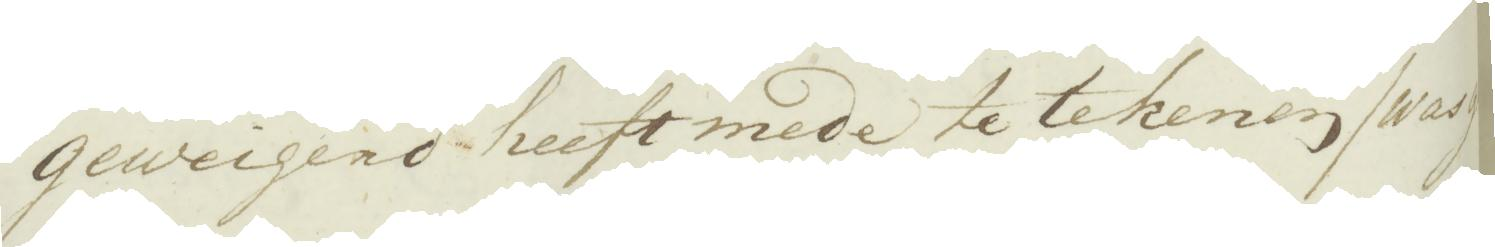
geweigerd heeft mede te tekenen /was g
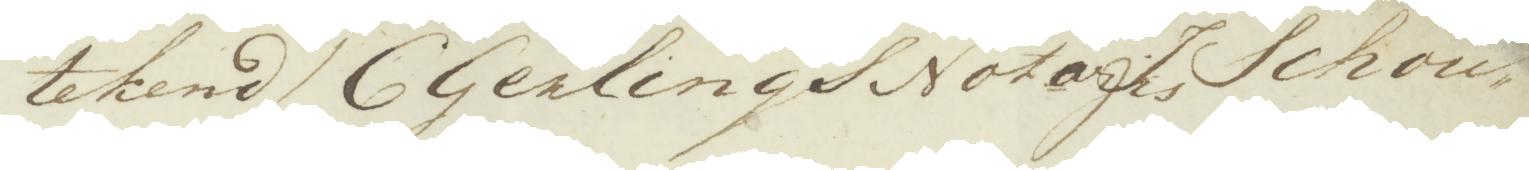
tekend / C Gerlings Notaris J Schou„
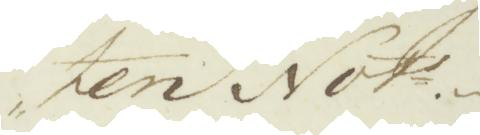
„ten Not=s.
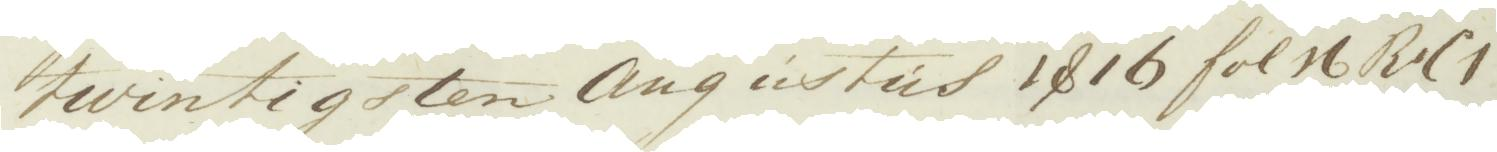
twintigsten Aug ustus 1816 fol N Rs C1
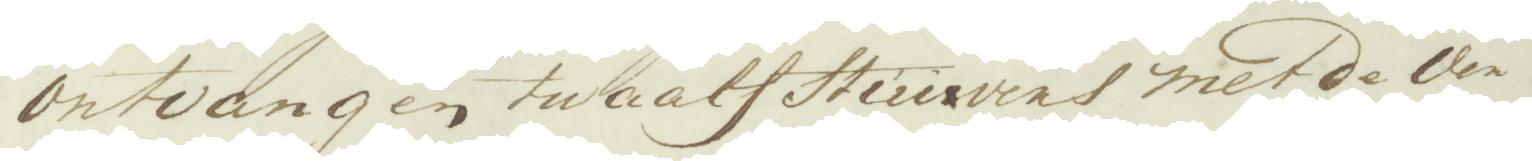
Ontvangen twaalf stuivers met de ver
